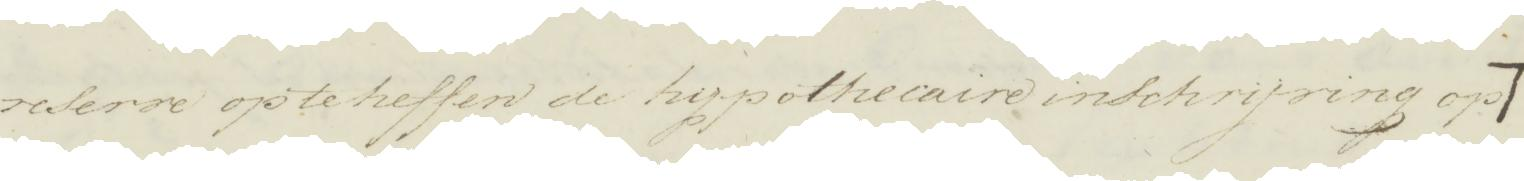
reserve op te heffen de hypothecaire inschrijving op T
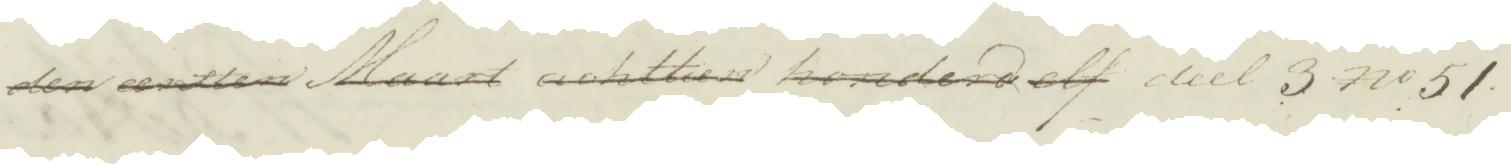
den eersten Maart achttien honderd elf deel 3 no 51
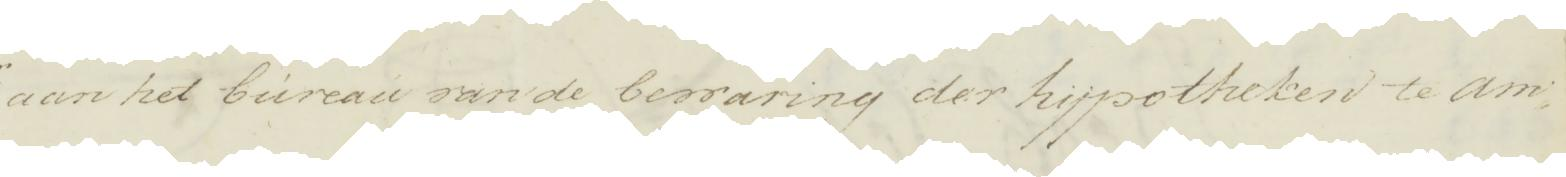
aan het bureau van de bewaring der hijpotheken te am„
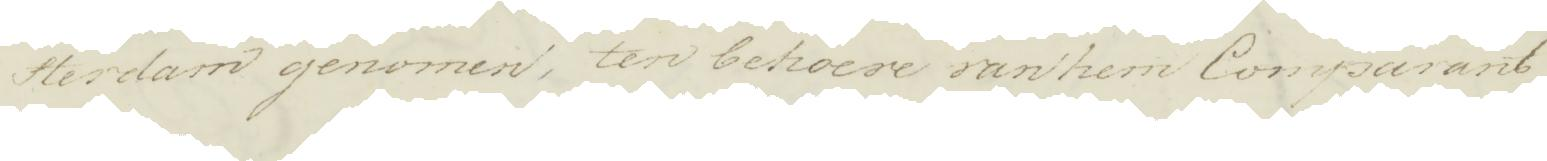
sterdam genomen, ten behoeve van hem Comparant
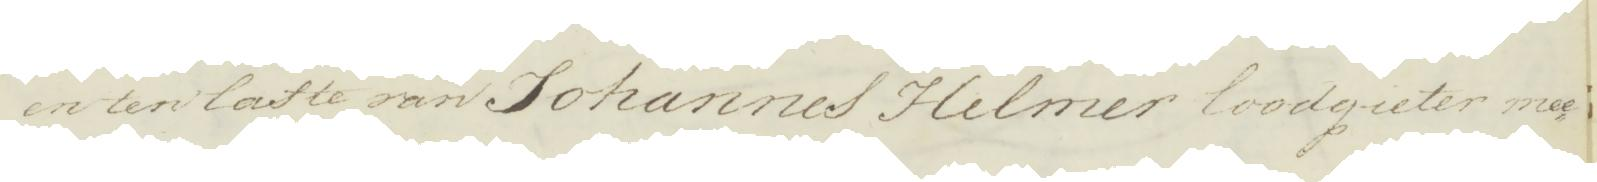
en ten laste van Johannes Helmer loodgieter mee„
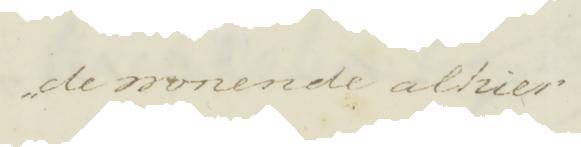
„de wonende alhier
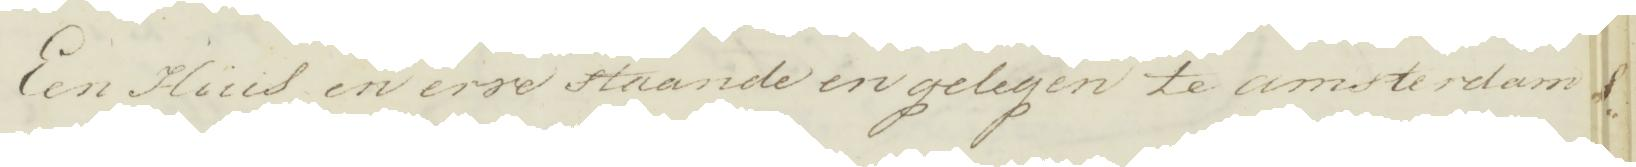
Een Huis en erve staande en gelegen te amsterdam
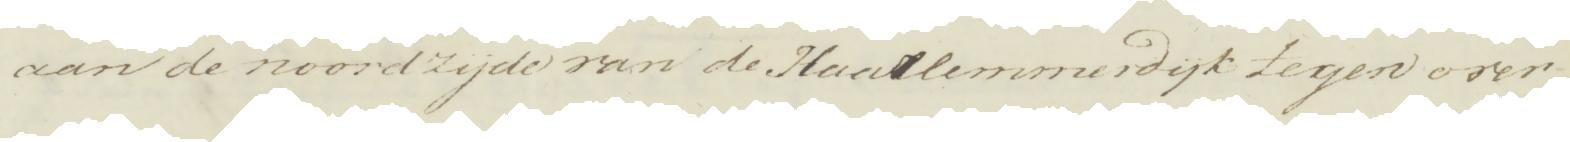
aan de noordzijde van de Haarlemmerdijk tegen over
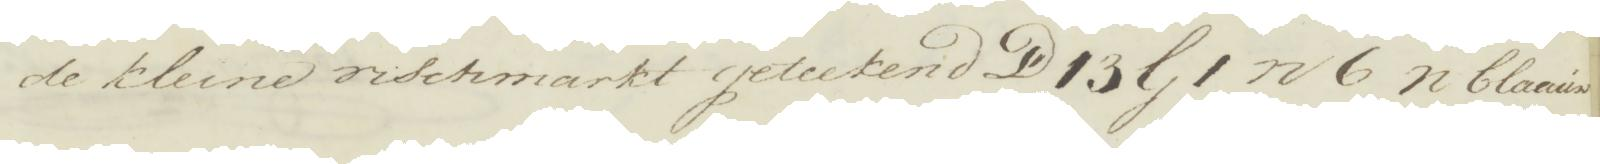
de kleine vischmarkt geteekend D 13 G 1 n 6 n blaauw
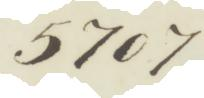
5707
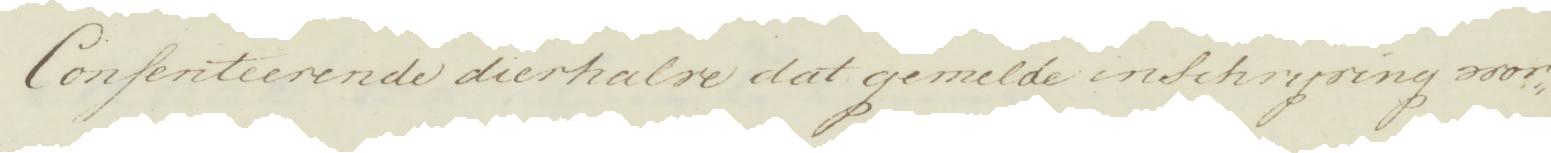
Consenteerende dierhalve dat gemelde inschrijving wor„
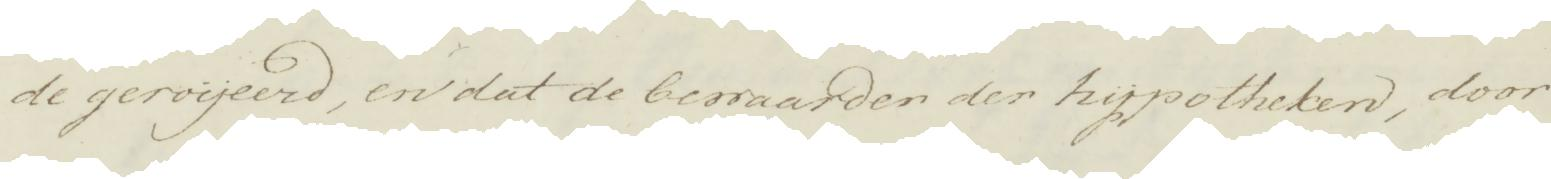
de geroijeerd, en dat de bewaarder der hijpotheken, door
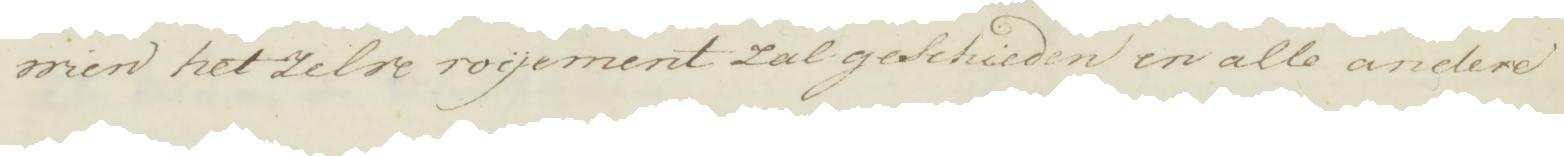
wien het zelve roijement zal geschieden en alle andere
